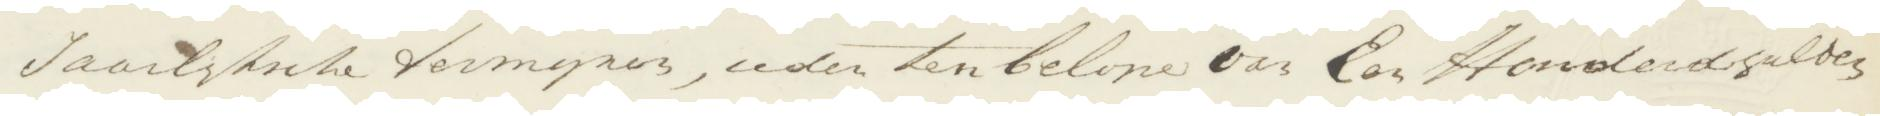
Iaarlijksche termynen, ieder ten belope van Een Honderd gulden
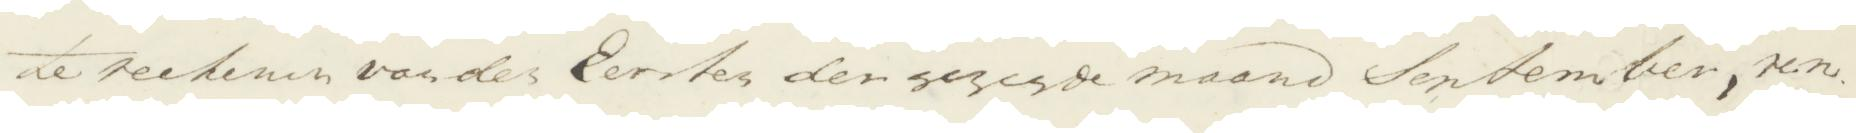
te reekenen van den Eersten der gezegde maand september, ren
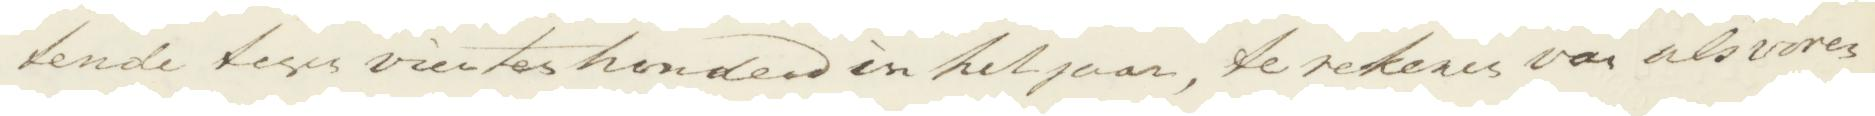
tende tegen vier ten honderd in het jaar, te rekenen van als voren
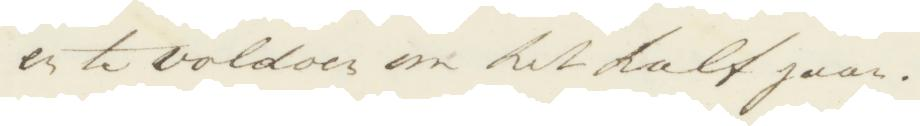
en te voldoen om het half jaar.
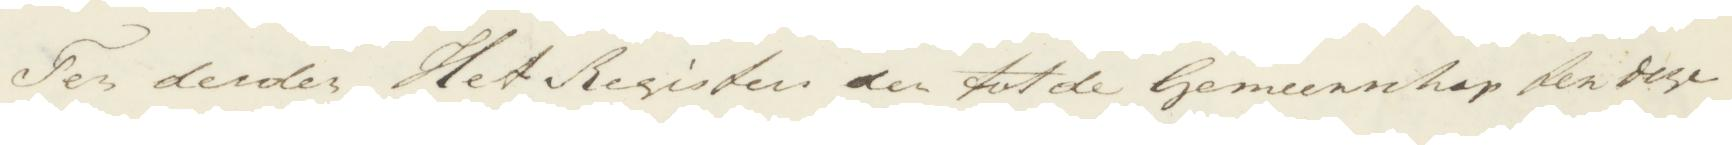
Ten derden, Het Register der tot de Gemeenschap ten deze
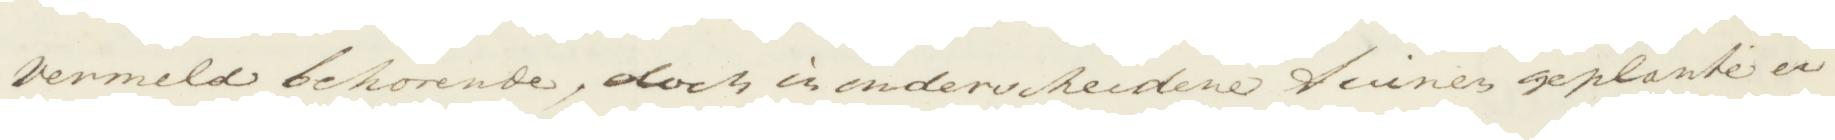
vermeld behorende, doch in onderscheidene Tuinen geplante en
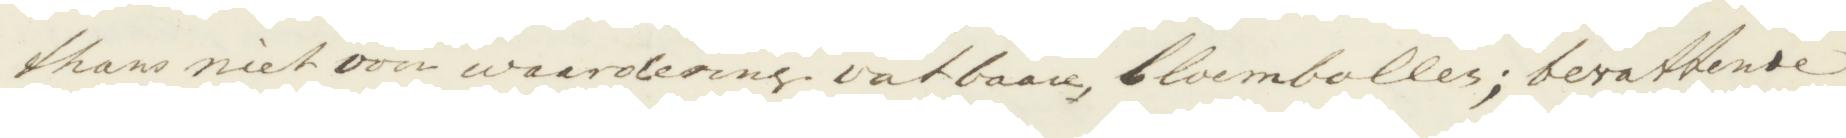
thans niet voor waardering vatbaare, bloembollen; bevattende
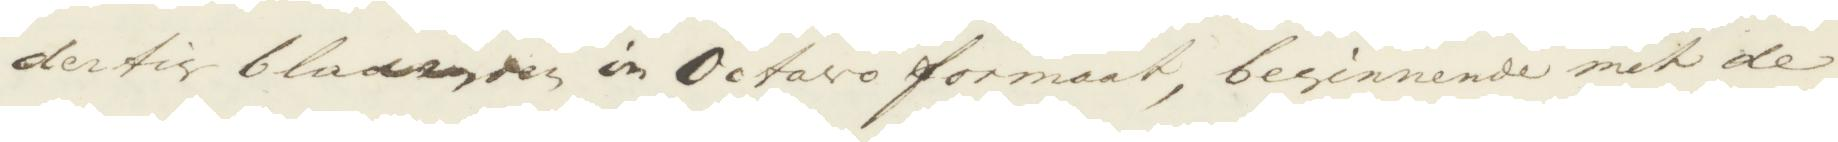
dertig bladzijden in Octavo formaat, beginnende met de
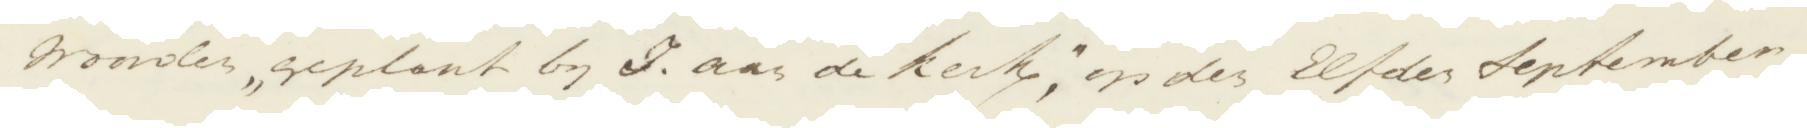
Woorden „geplant bij I. aan de kerk, op den Elfden september
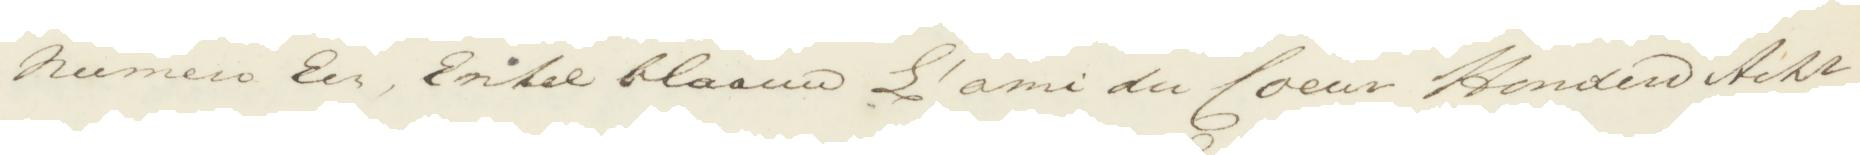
Numero Een, Enkel blaauw L'ami du Coeur Honderd Acht
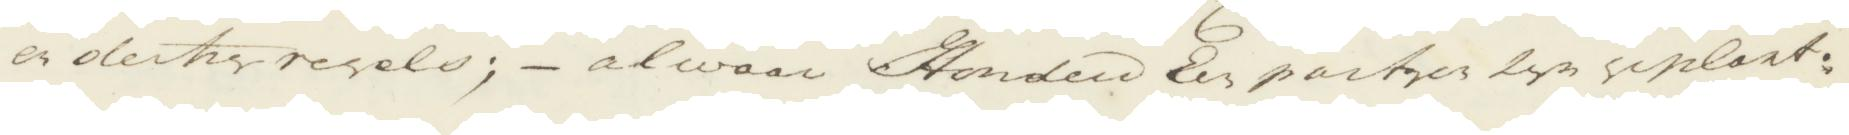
en dertig regels; - alwaar Honderd Een partyen zyn geplant:
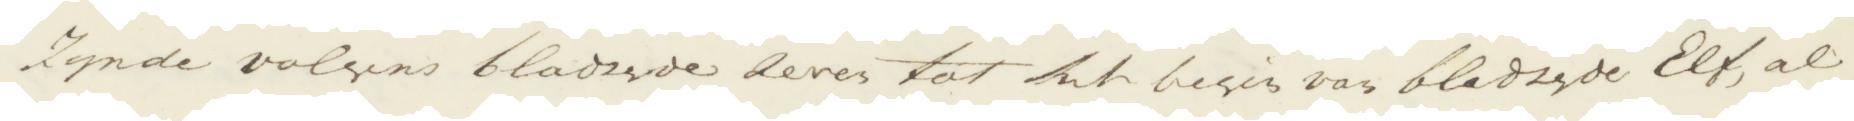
Zynde volgens bladzyde zeven tot het begin van bladzyde Elf, al
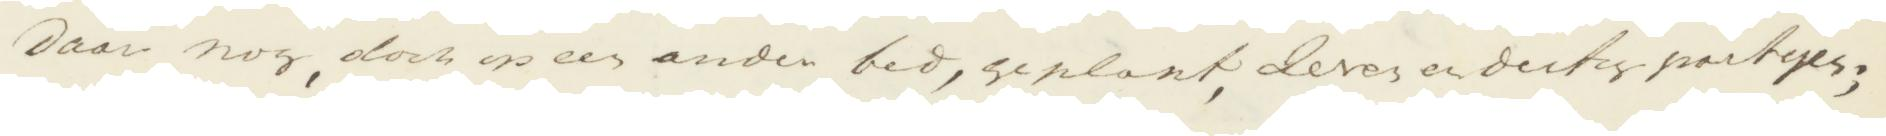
daar nog, doch op een ander bed, geplant, zeven en dertig partyen;
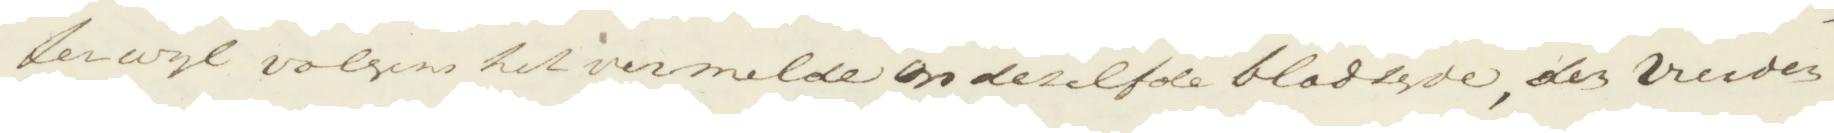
terwyl volgens het vermelde op dezelfde bladzyde, den vierden
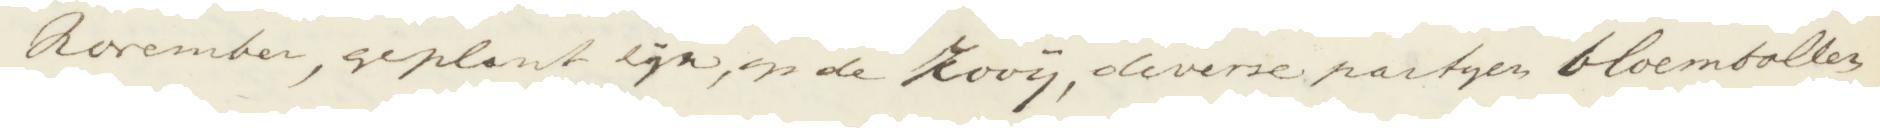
November, geplant zijn, op de Kooij, diverse partyen bloembollen
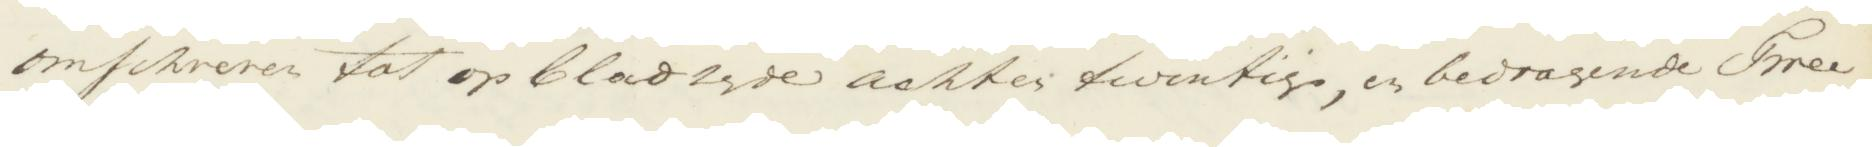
omschreven tot op bladzyde achten twintig, en bedragende Twee
